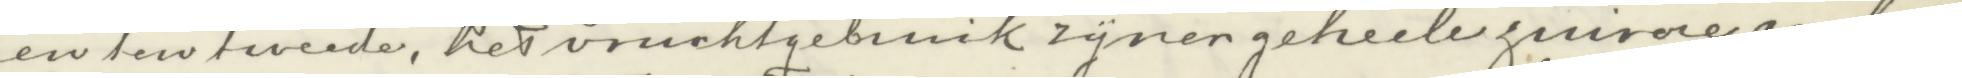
en ten tweede, het vruchtgebruik zijner geheele zuivere nala,
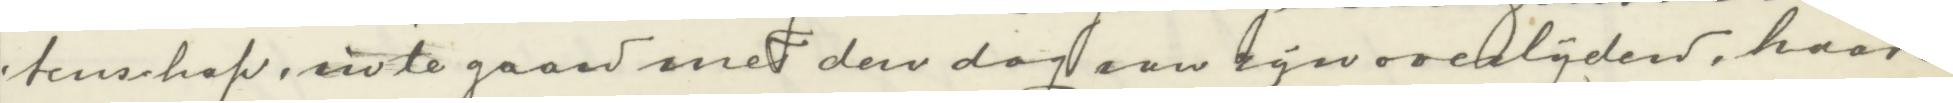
tenschap, in te gaan met den dag van zijn overlijden, haar
